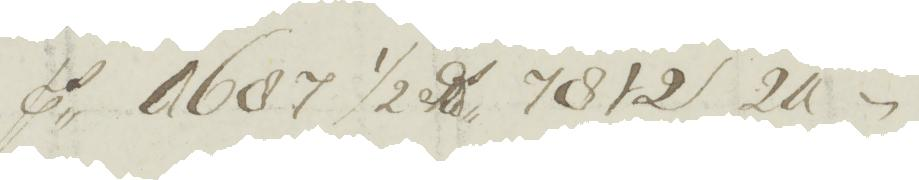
p„s 4687 ½ Rd„s 7812 24 —
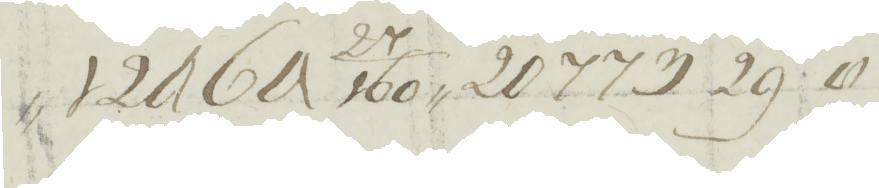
„ 12464 27/160 „ 20773 29 8
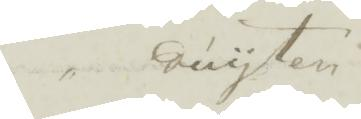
„ duijten
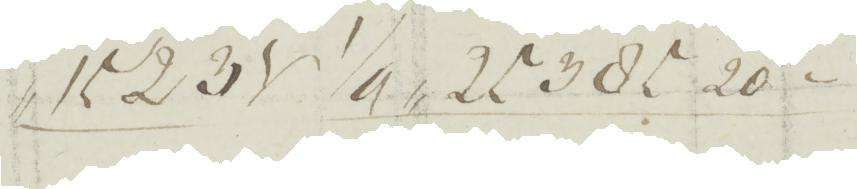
„15231¼ „ 25385 20 —
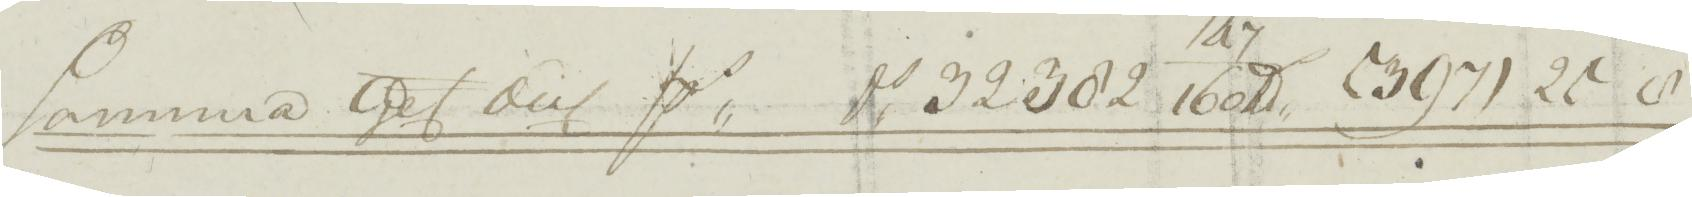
Somma Gec duc p„s d„s 32382 147/160 rd„s 53971 25 8
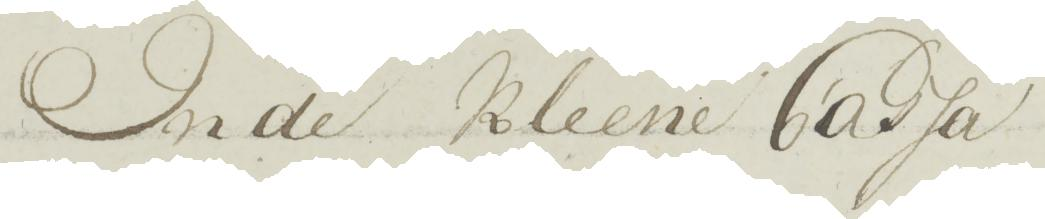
In de kleene Cassa
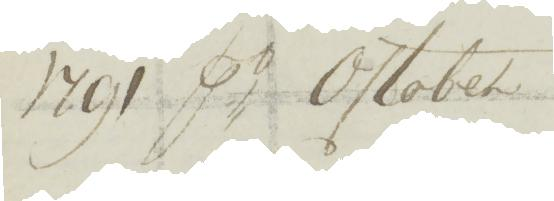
1791 p„s October
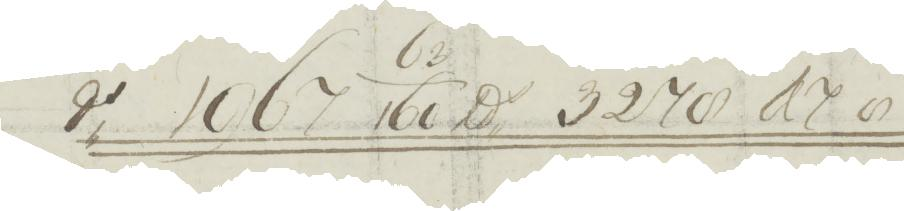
d„s 1967 62/160 rd„s 3278 47 8
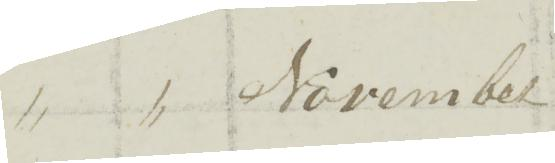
„ „ November
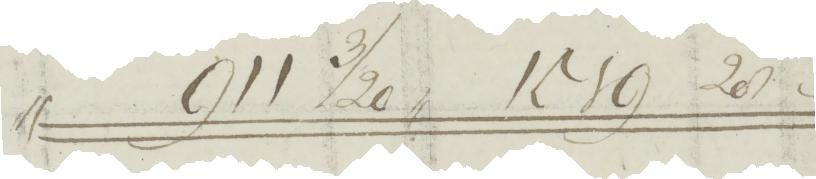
„ 911 3/20 „ 1519 28
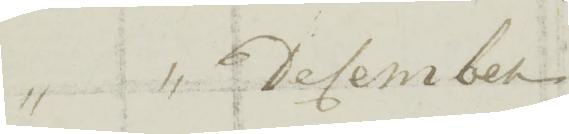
„ „ december
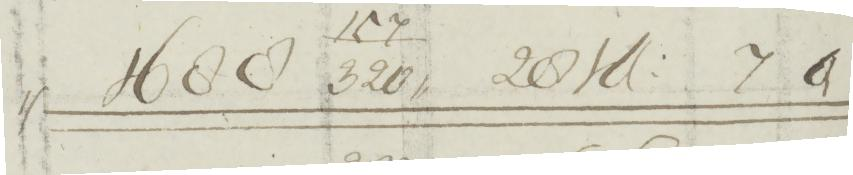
„ 1688 157/320 „ 2814: 7 4
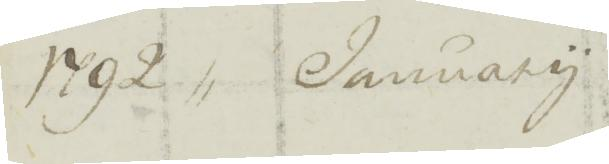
1792 „ Ianuarij
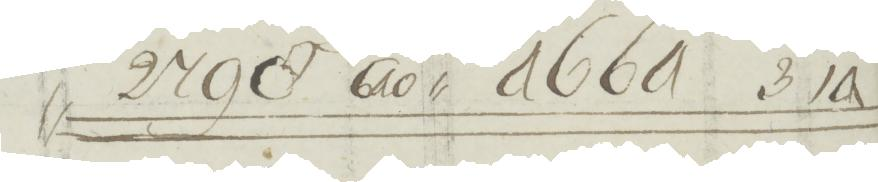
" 2798 207/610 „ 4664 3 14
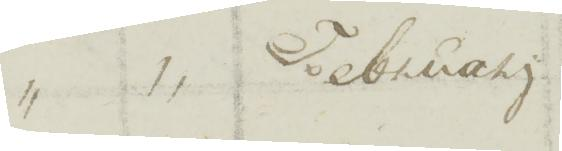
„ „ Februarij
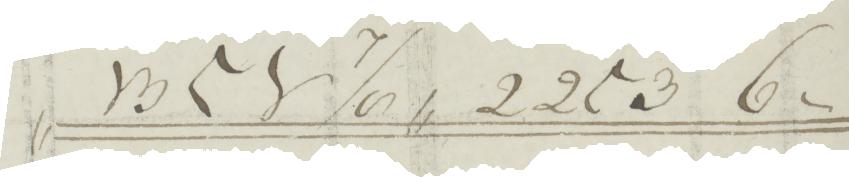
„ 1351 7/8 „ 2253 6 —
